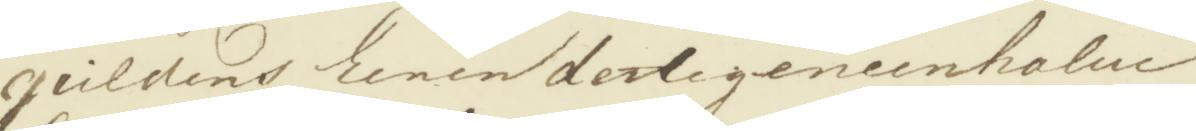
guldens Eenen dertig en eenhalve
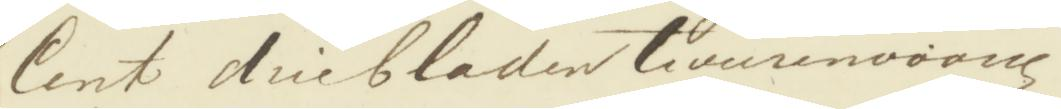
Cent drie bladen twee renvooyen
